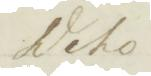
Dito . . . . . . . .
